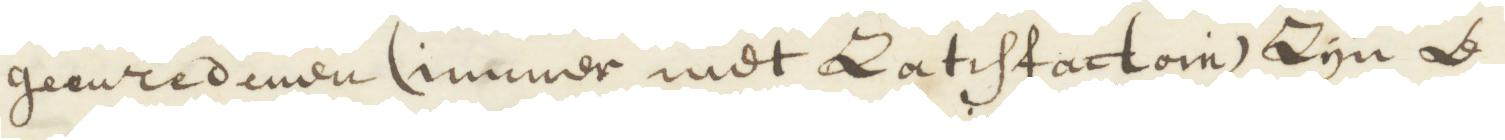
geen redenen (immer niet zatisfactoir) zijn te
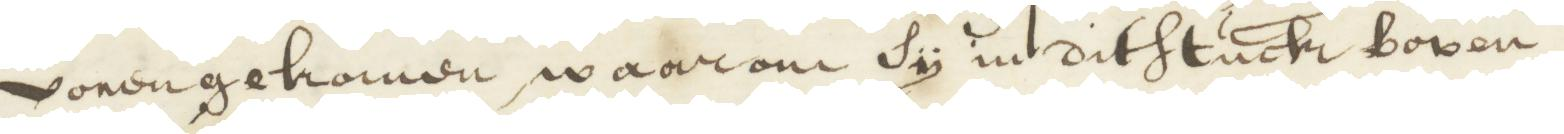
voren gekomen, waarom sij in dit stuck boven
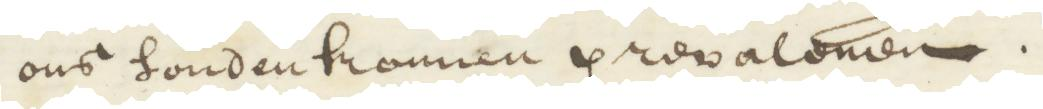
ons souden konnen prevaleren.
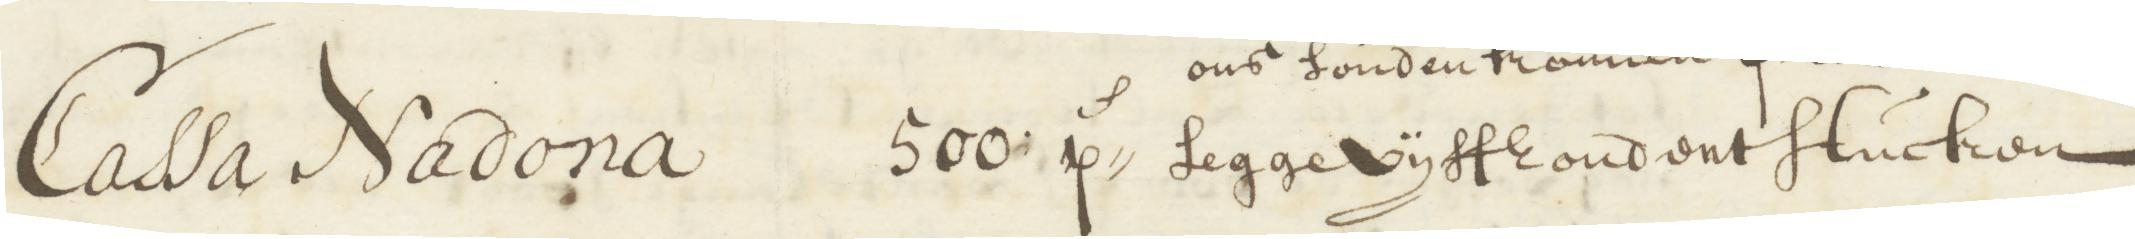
Cassa Nadona 500: p„s segge vijff hondert stucken
